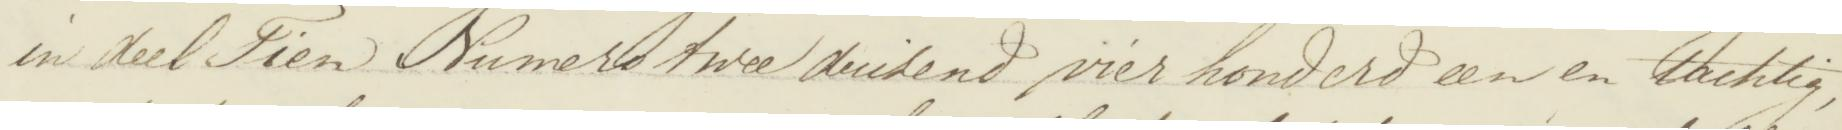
in deel Tien Numero twee duizend vier honderd een en tachtig,
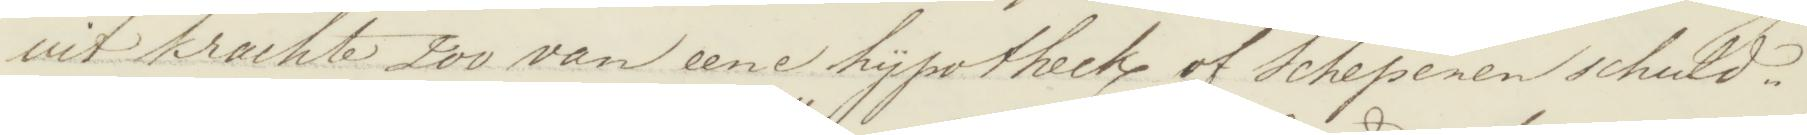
uit krachte zoo van eene hijpotheek of schepenen schuld„
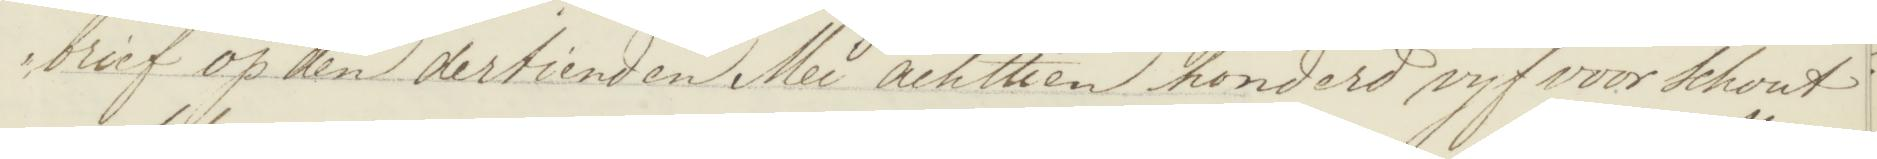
„brief op den dertienden Mei achttien honderd vyf voor Schout
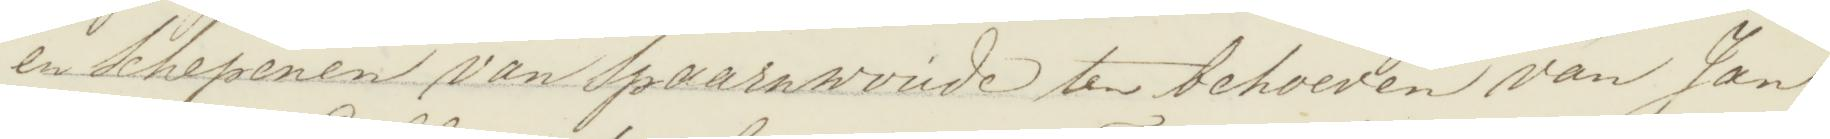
en Schepenen van Spaarnwoude ten behoeven van Jan
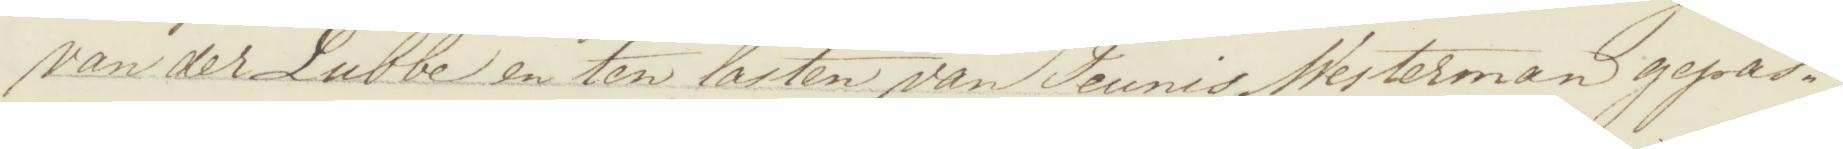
van der Lubbe en ten lasten van Teunis Westerman gepas„
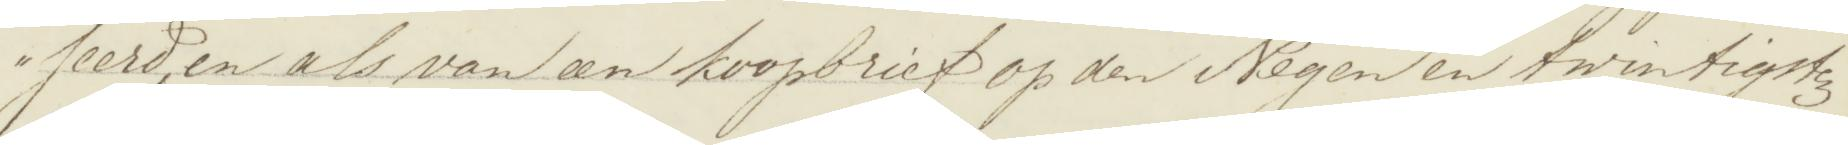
„seerd, en als van een koopbrief op den Negen en twintigsten
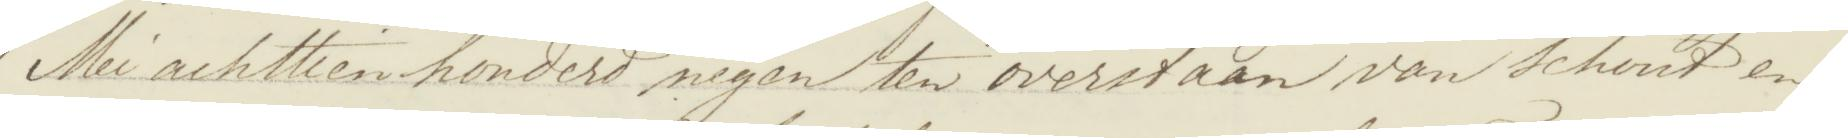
Mei achttien honderd negen ten overstaan van Schout en
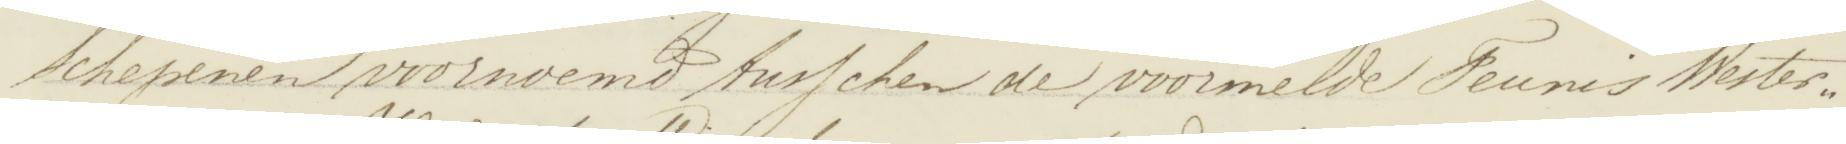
Schepenen voornoemd tusschen de voormelde Teunis Wester„
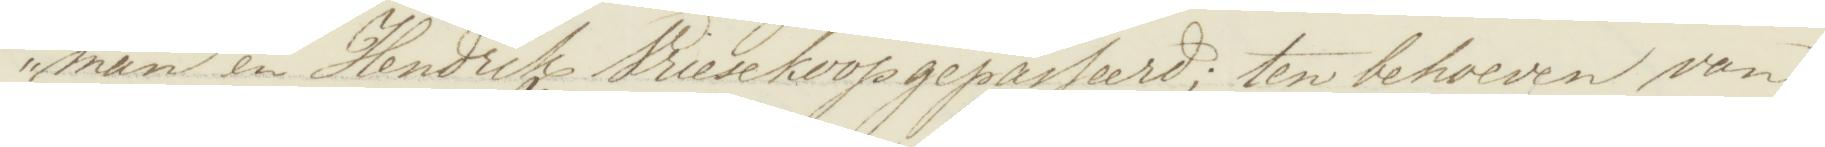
„man en Hendrik Vriesekoop gepasseerd; ten behoeven van
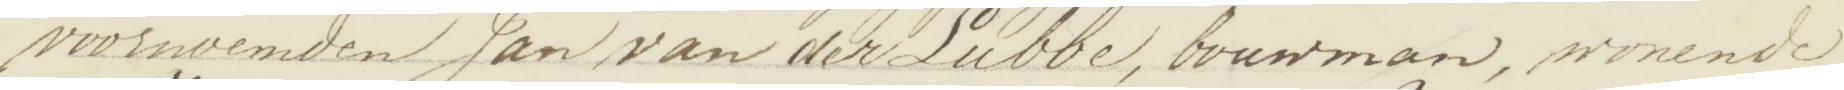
voornoemden Jan van der Lubbe, bouwman, wonende
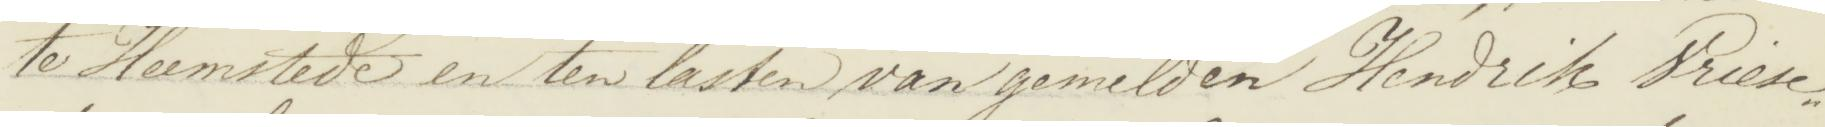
te Heemstede en ten lasten van gemelden Hendrik Vriese„
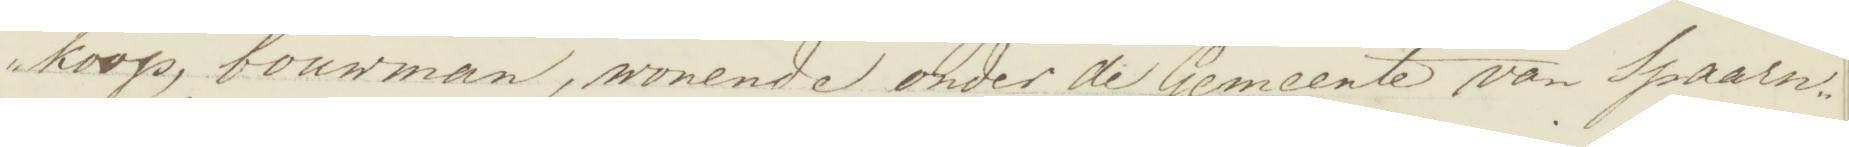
„koop, bouwman, wonende onder de Gemeente van Spaarn„
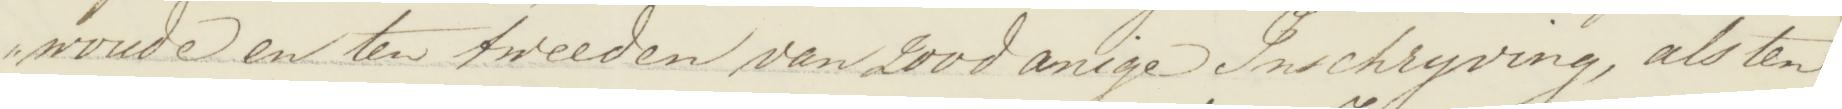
„woude en ten tweeden van zoodanige Inschryving, als ten
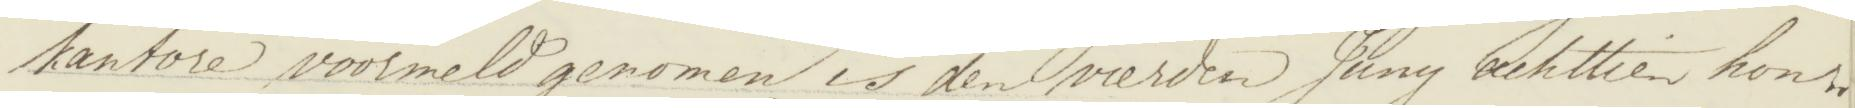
kantore voormeld genomen is den vierden Juny achttien hon„
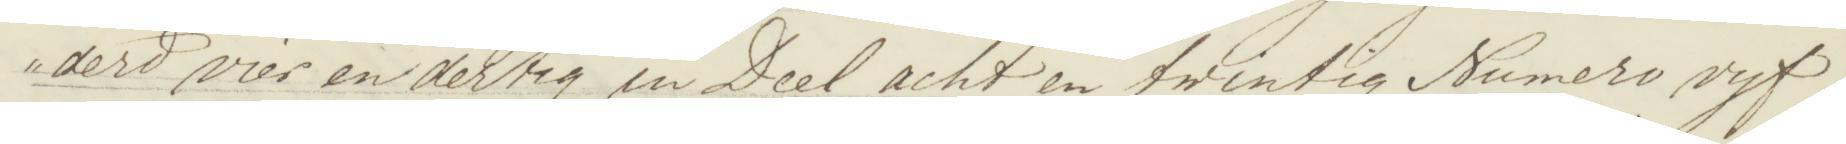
„derd vier en dertig in Deel acht en twintig Numero vijf
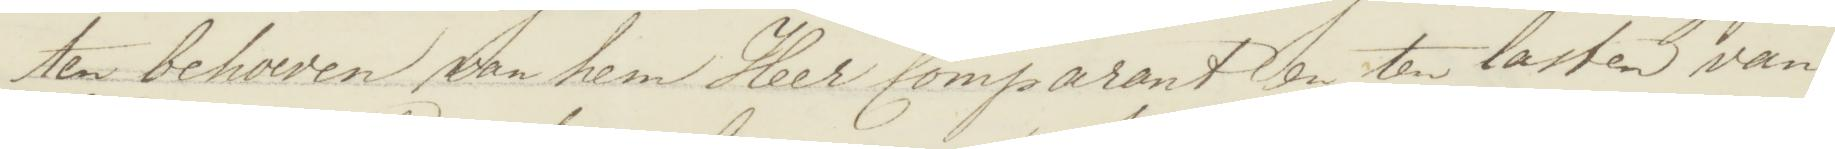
ten behoeven van hem Heer Comparant en ten lasten van
